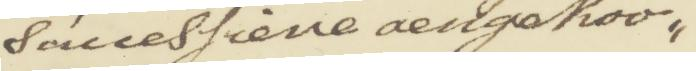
successieve aengekoo„
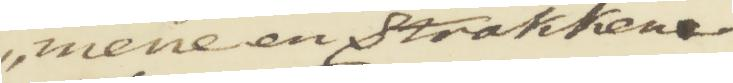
„mene en vertrokkene
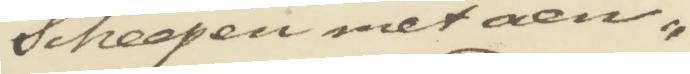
Scheepen met aen„
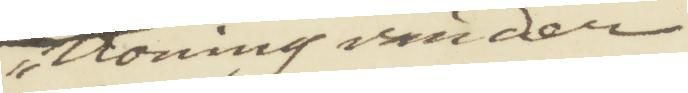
„thoning van der
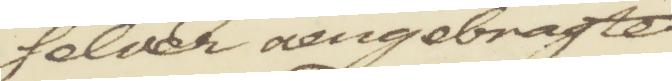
selver aengebragte
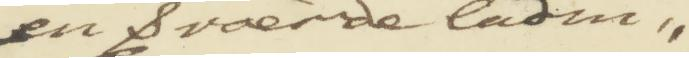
en vervoerde ladin„
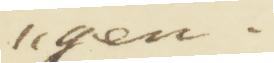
„gen.
